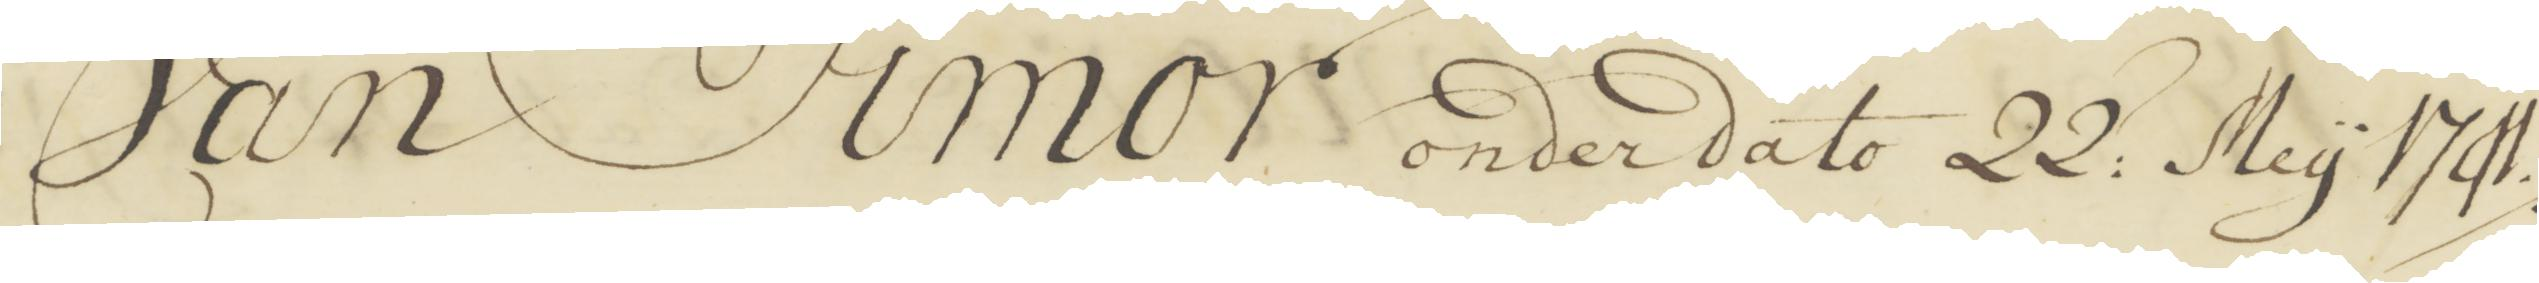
Van Timor onder dato 22:' Meij 1741.
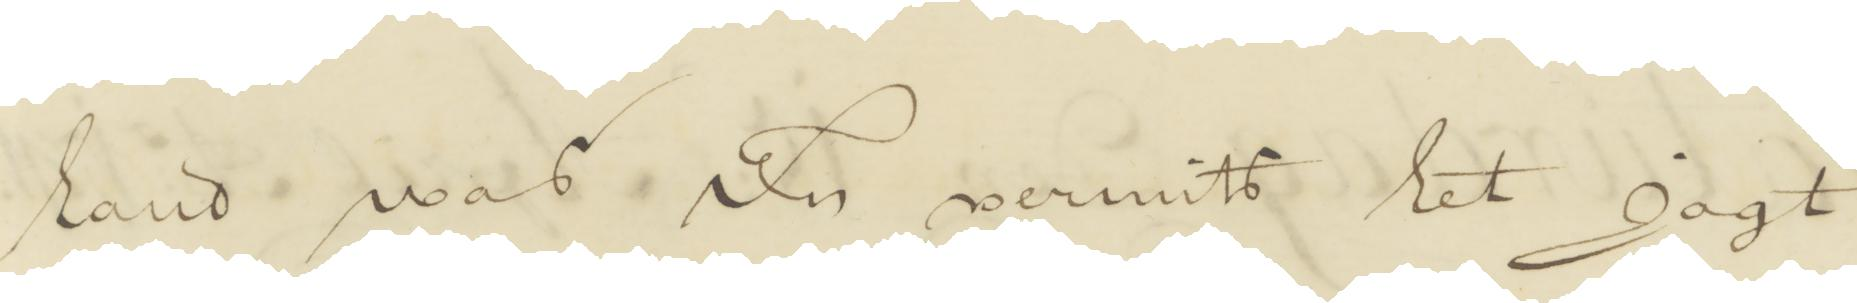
hand was En vermits het jagt
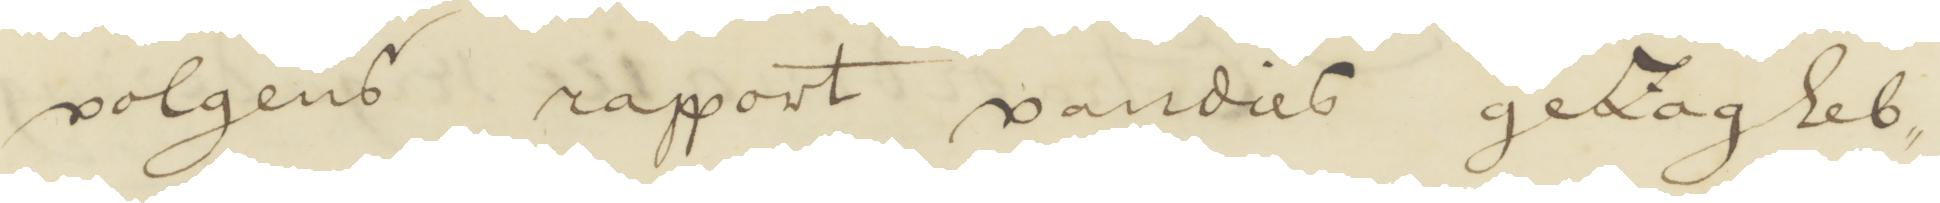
volgens rapport vandies gezagheb„
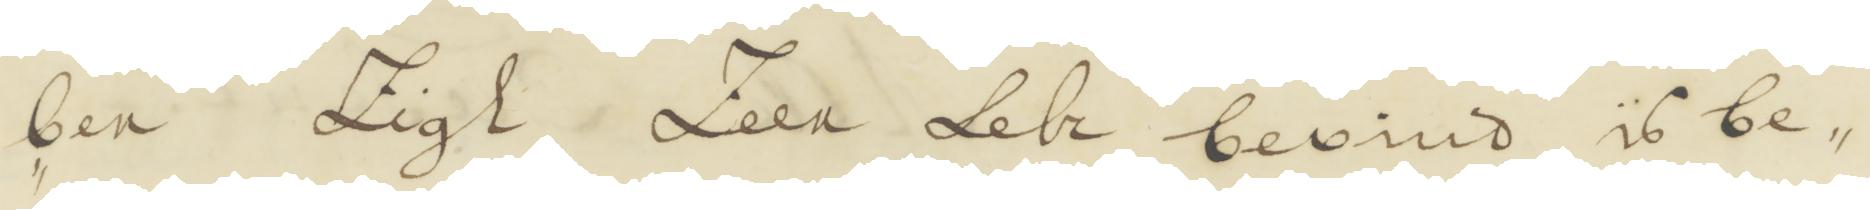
„ber zigh zeer lek bevind is be„
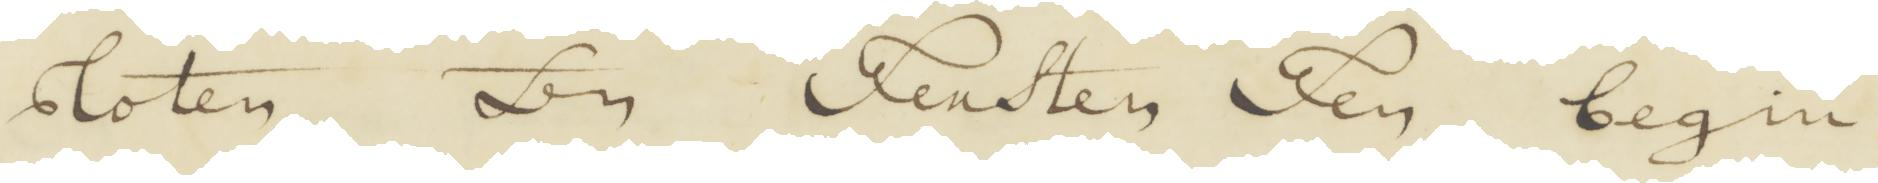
sloten ten Eersten Een begin
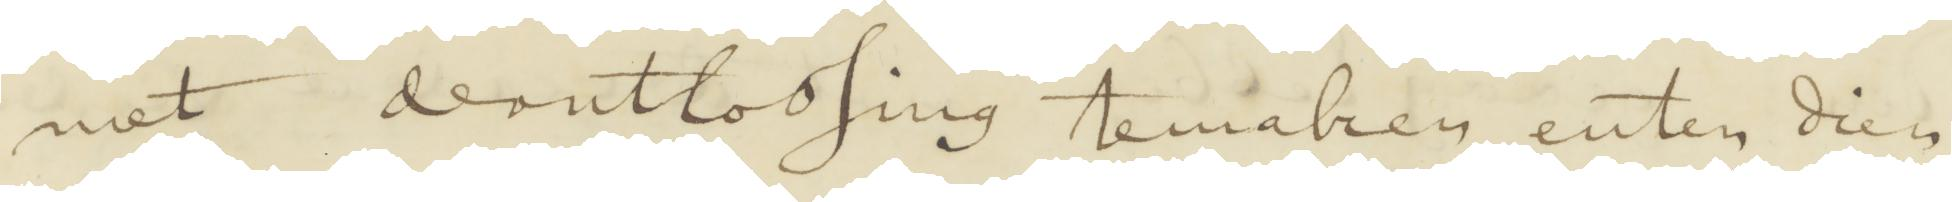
met deontlossing temaken enten dien
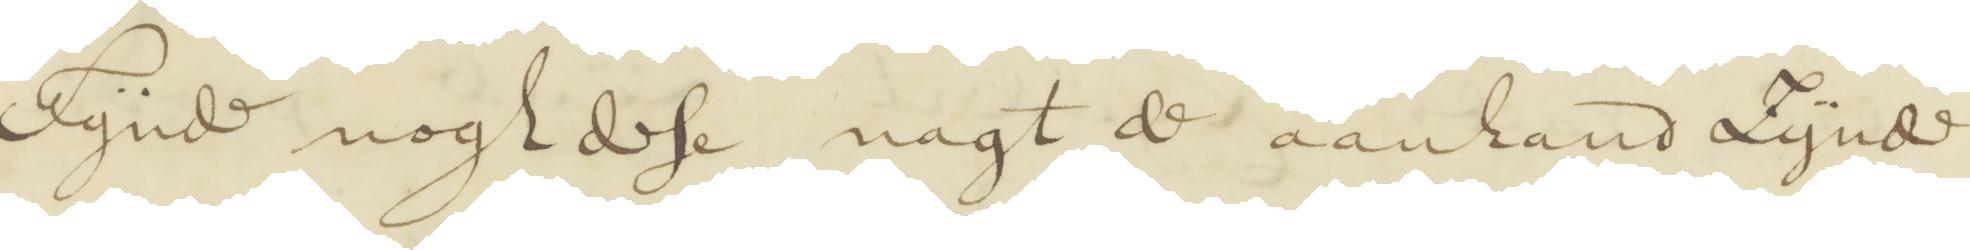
Eijnde nogh dese nagt de aanhand zijnde
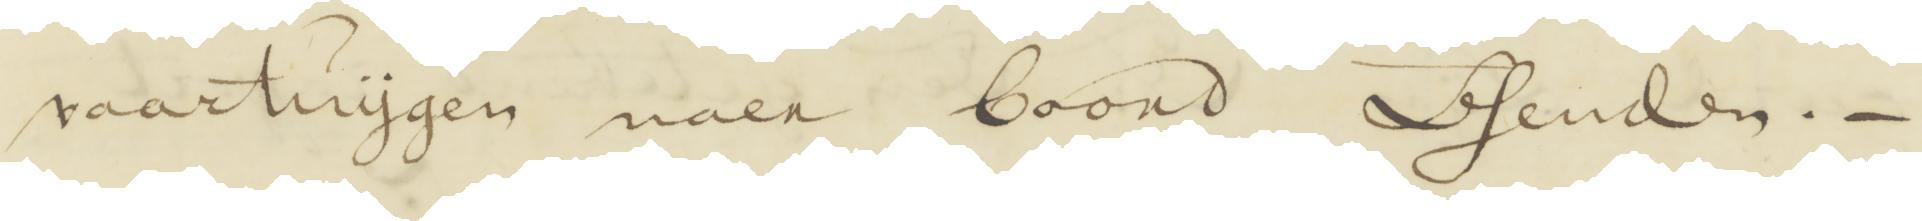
vaartuijgen naer boord tesenden. —
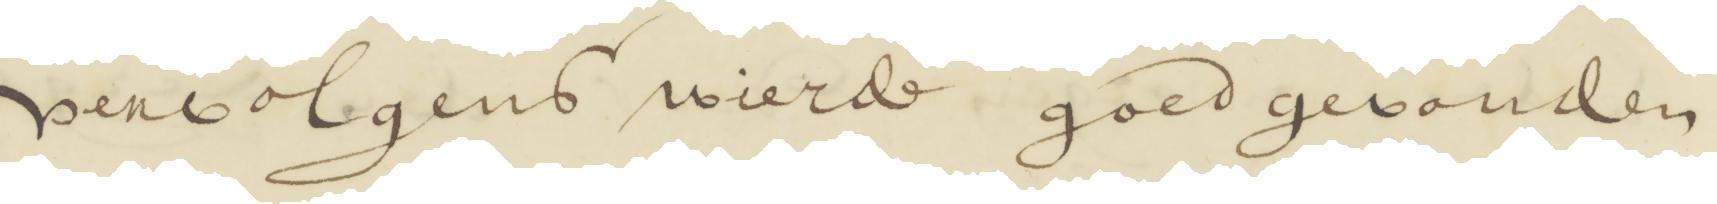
vervolgens wierde goed gevonden
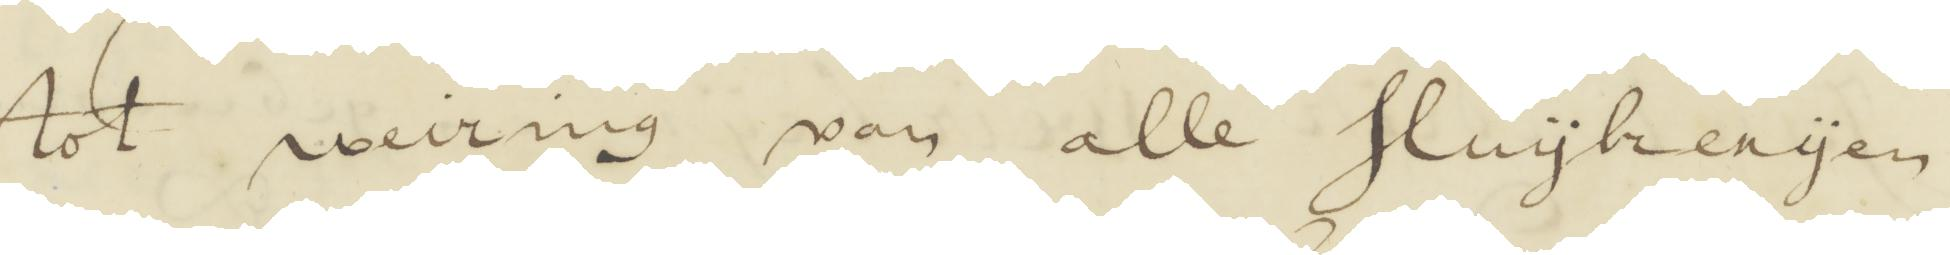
tot weiring van alle sluijkerijen
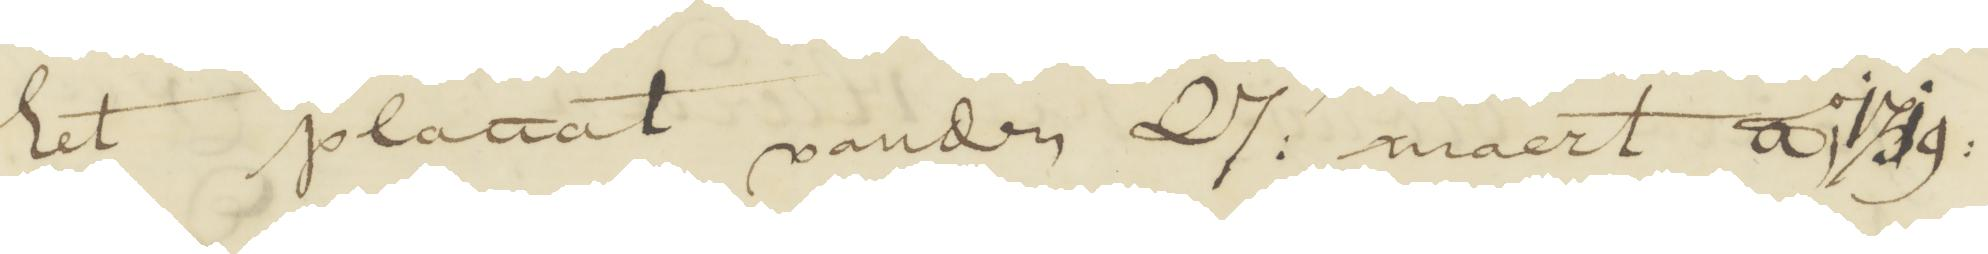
het placcat vanden 27:' maert a„o 1719:
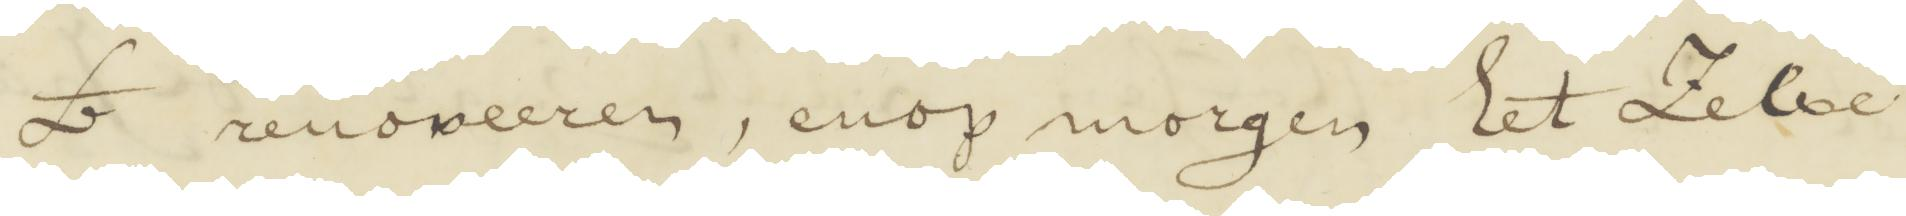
te renoveeren, enop morgen het zelve
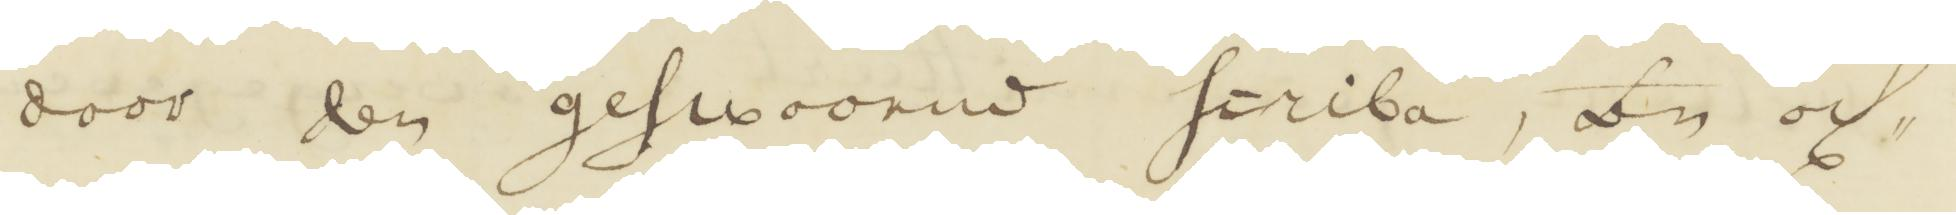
door den geswoorne scriba, ten over„
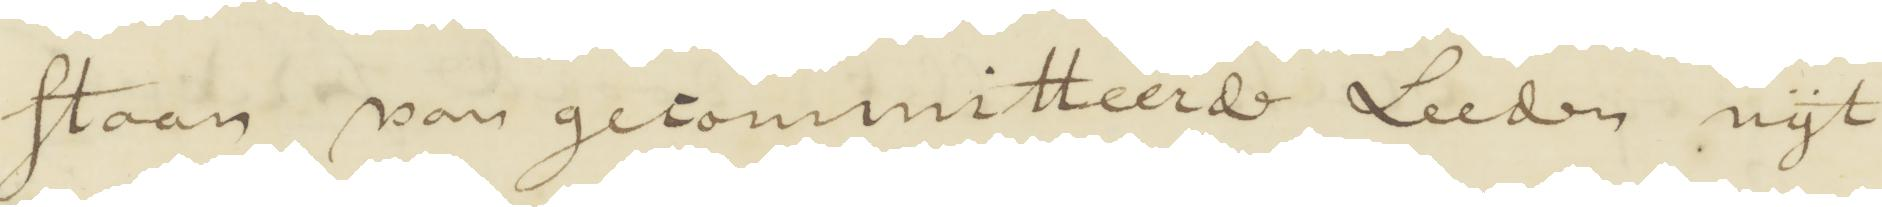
staan van gecommitteerde leeden uijt
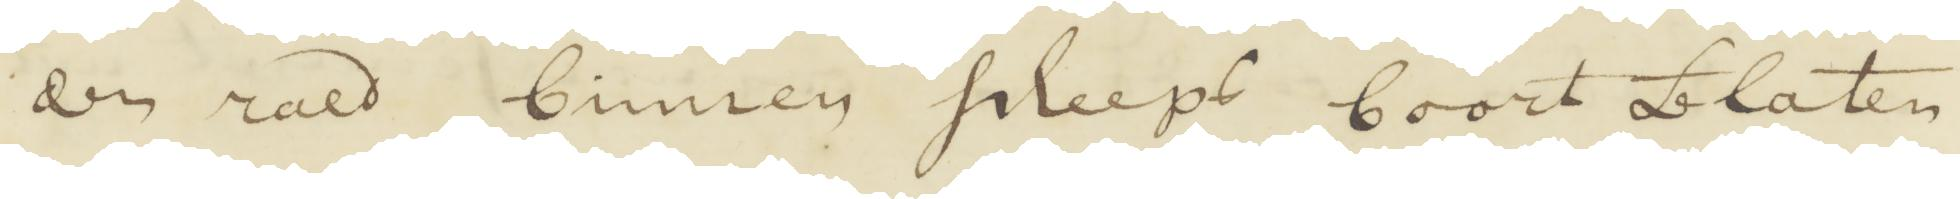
den raed binnen scheeps boort te laten
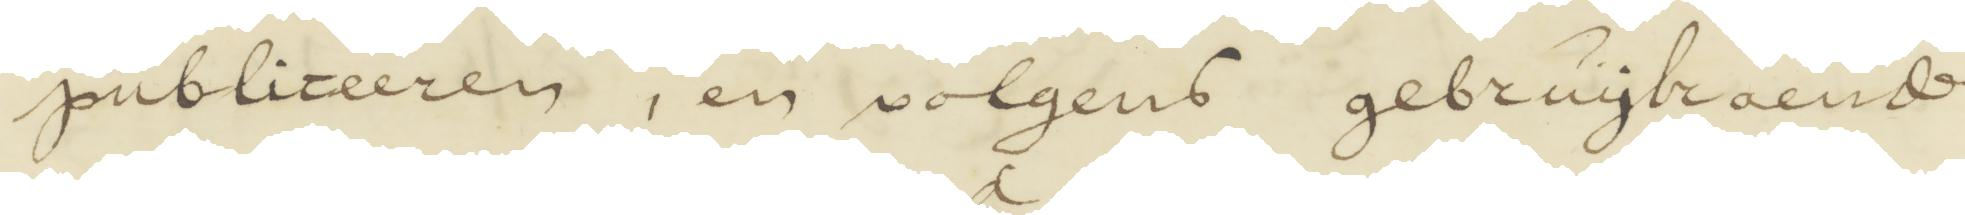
publiceeren, en volgens gebruijk aende
